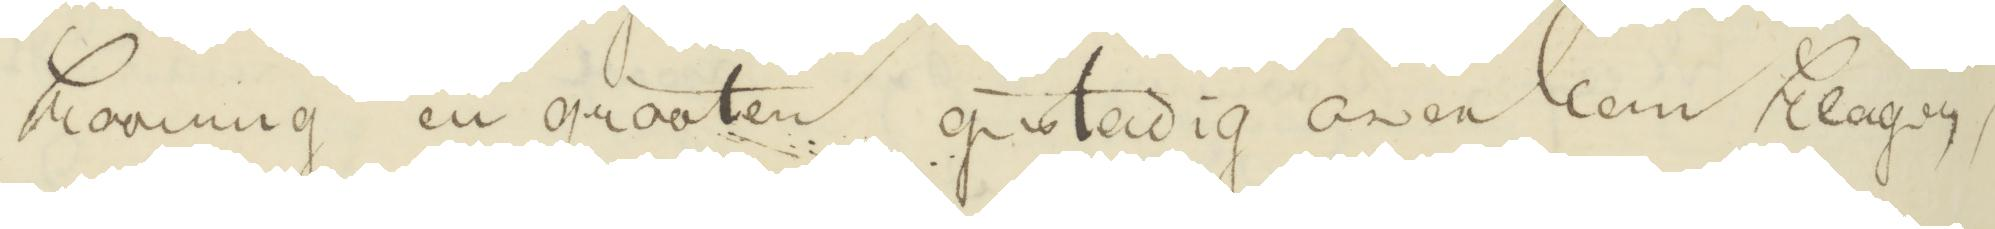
kooning en grooten gestadig over hem klagen
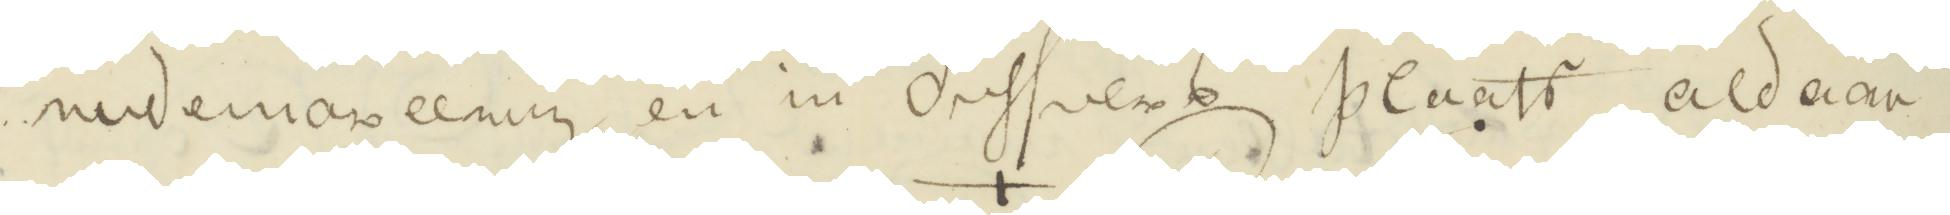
redemoveeren en in desselve plaats aldaar
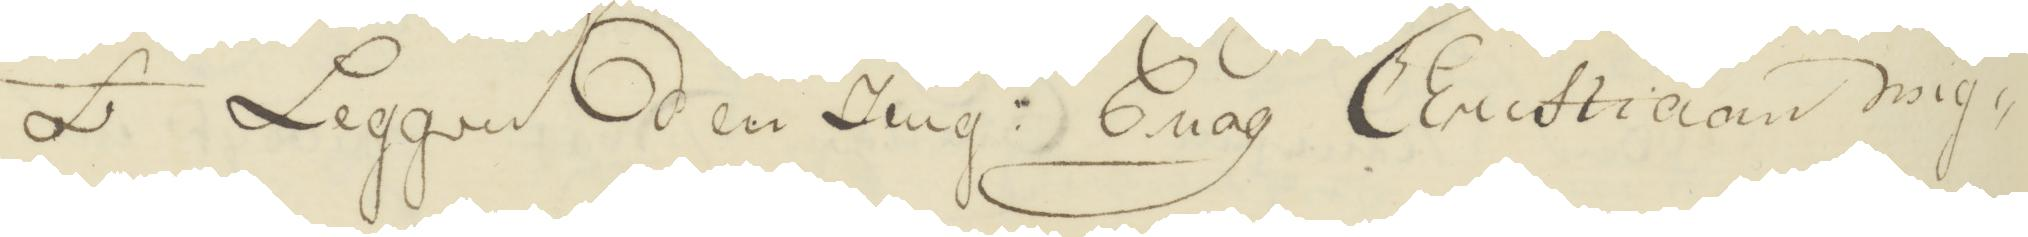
te Leggen den zerg:t Enog Christiaan wig„
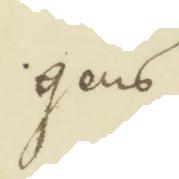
gers
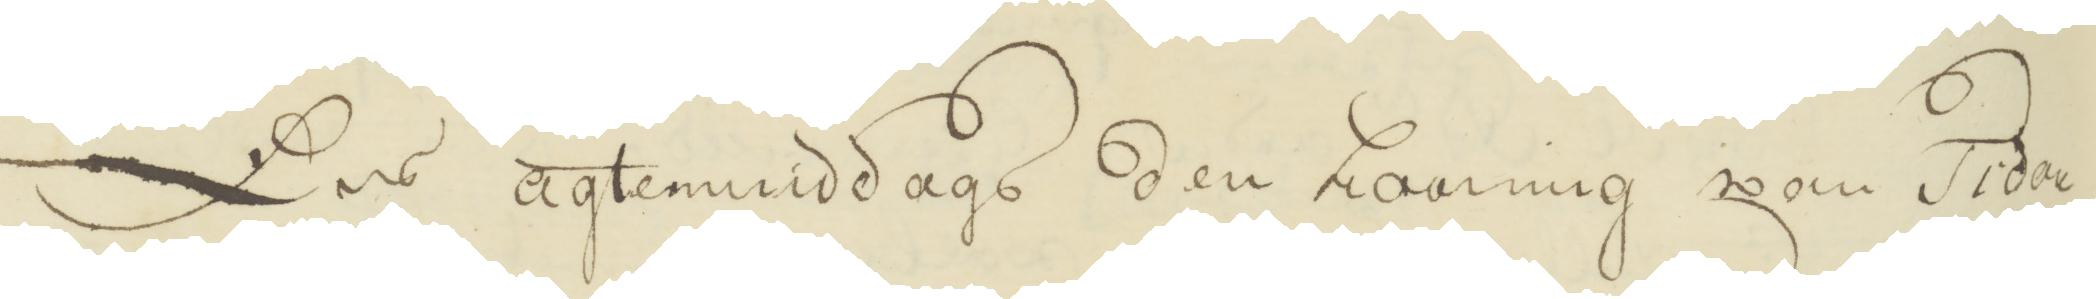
Des agtermiddags den kooning van Tidor
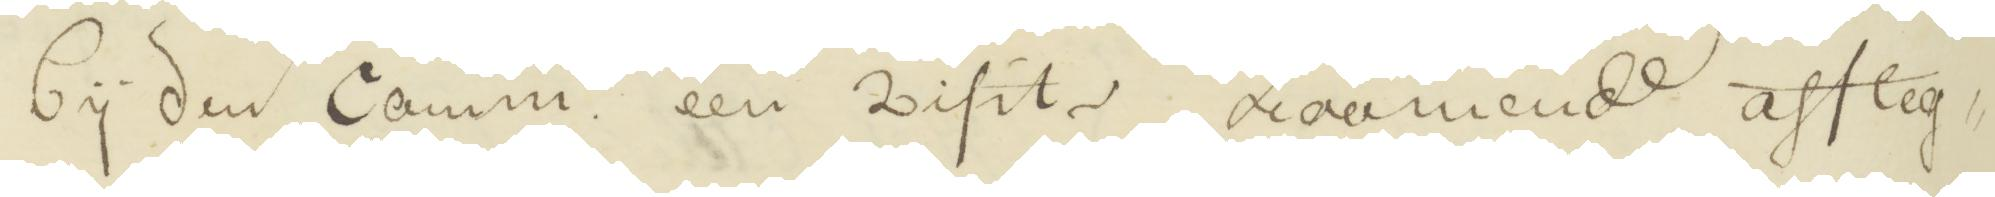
bij den Comm:s een visite koomende affleg„
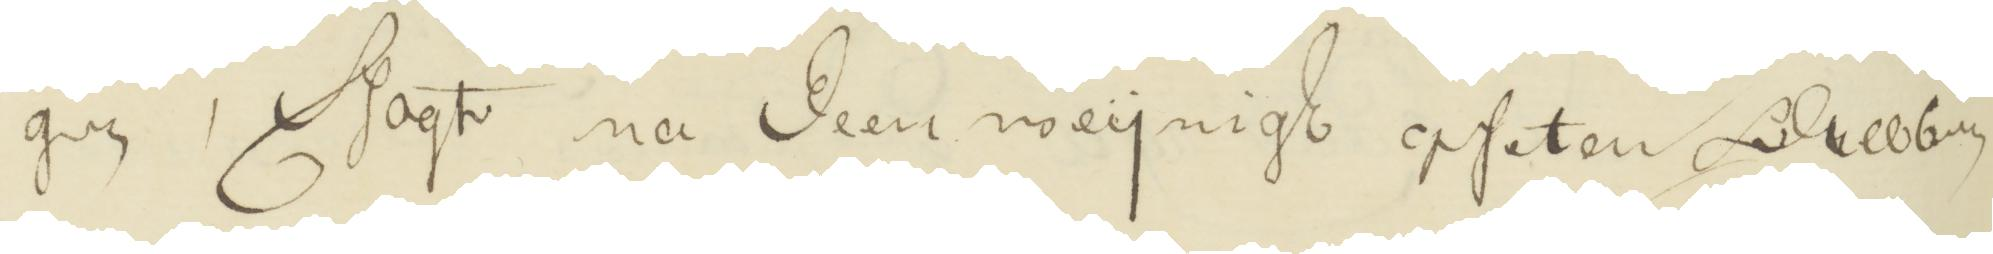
gen, versogt na Eeen weijnigh geseten te hebben
